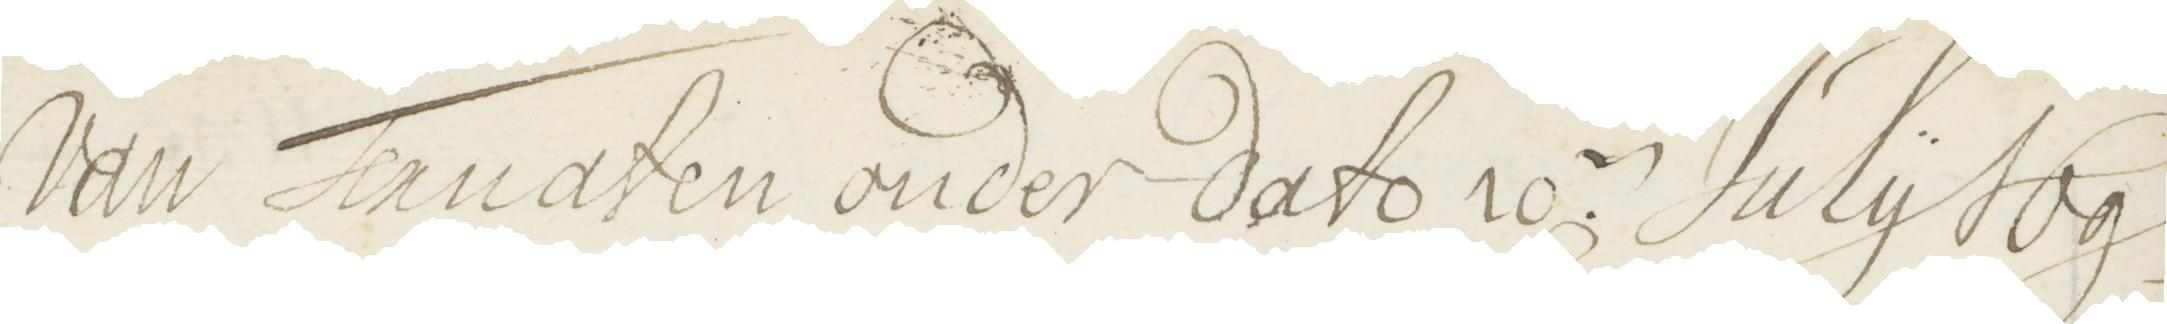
Van Ternaten onder dato 10.' Julij 1695.
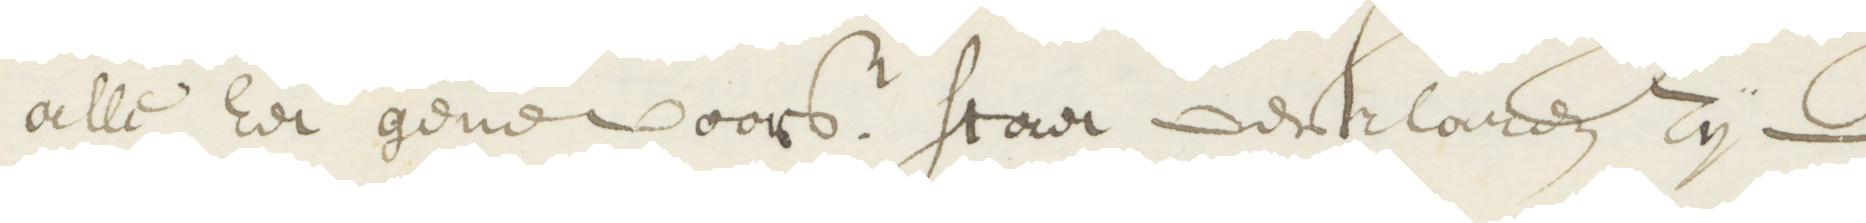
alle het gene voors.z staet verklaren zij
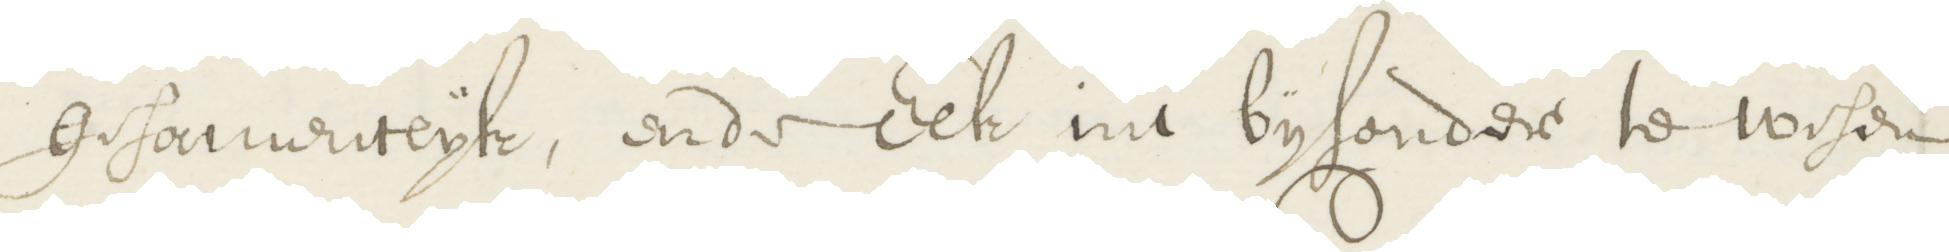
gesamentlijk, ende Elk in't bijsonder te wesen,
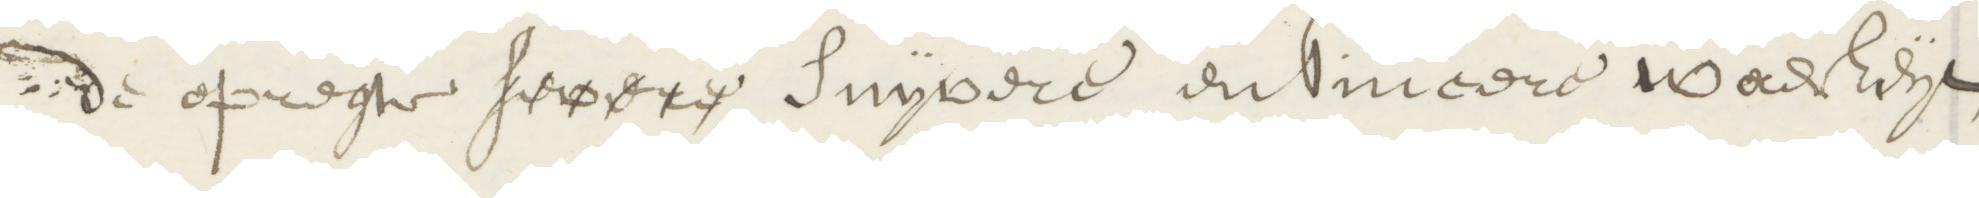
de opregte severe suijvere en sincere waerheijt
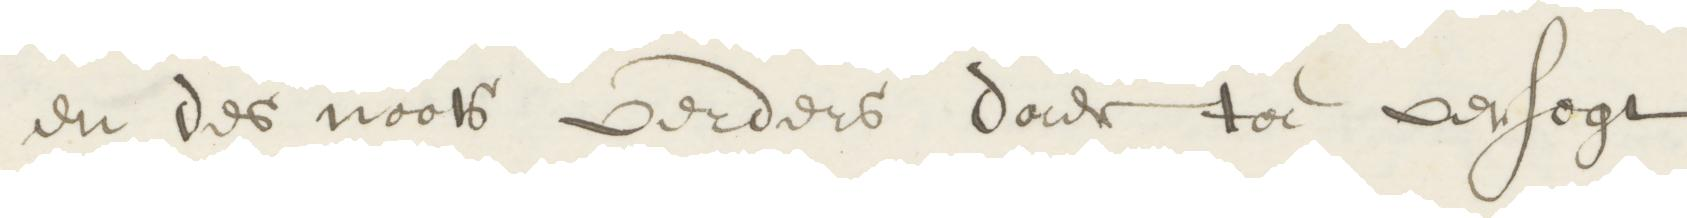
en des noots verders daer toe versogt
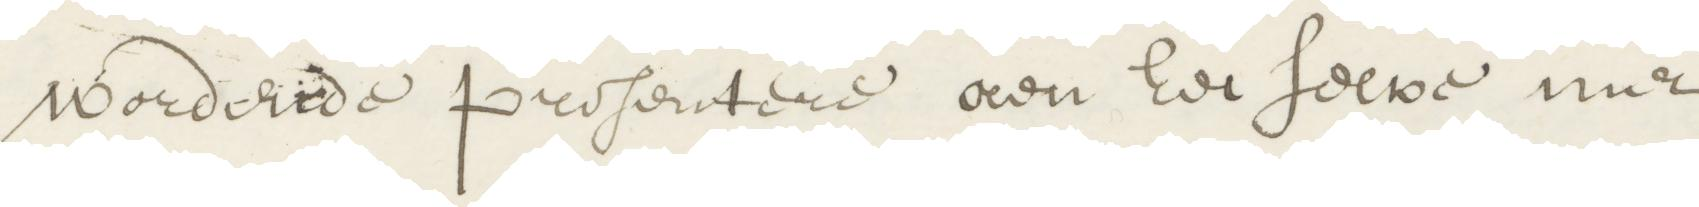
wordende presentere aen het selve met
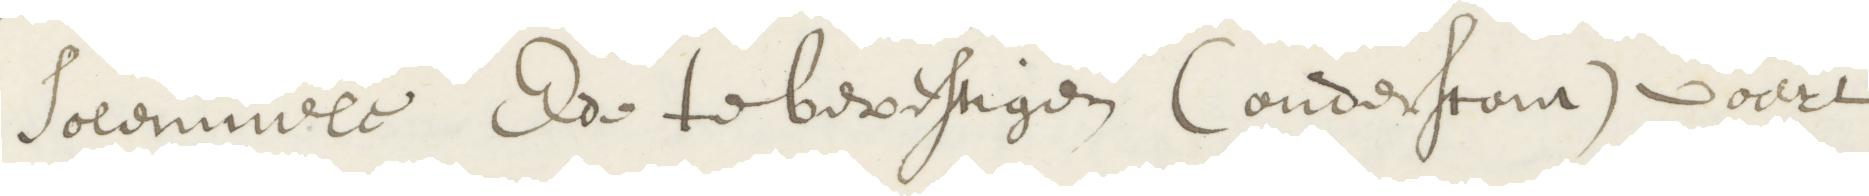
solemnele Ede te bevestigen (onderstont) voor't
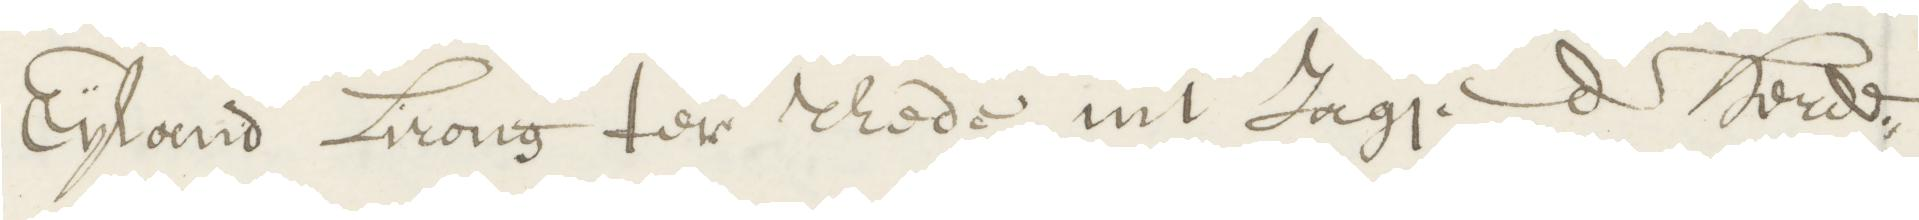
Eijland Lirong ter rhede in't Iagje de Herde„
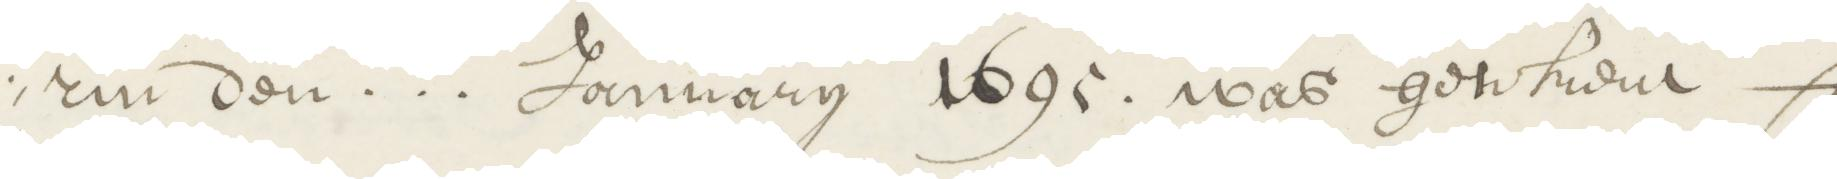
„rin den . . . Januarij 1695. was getekent
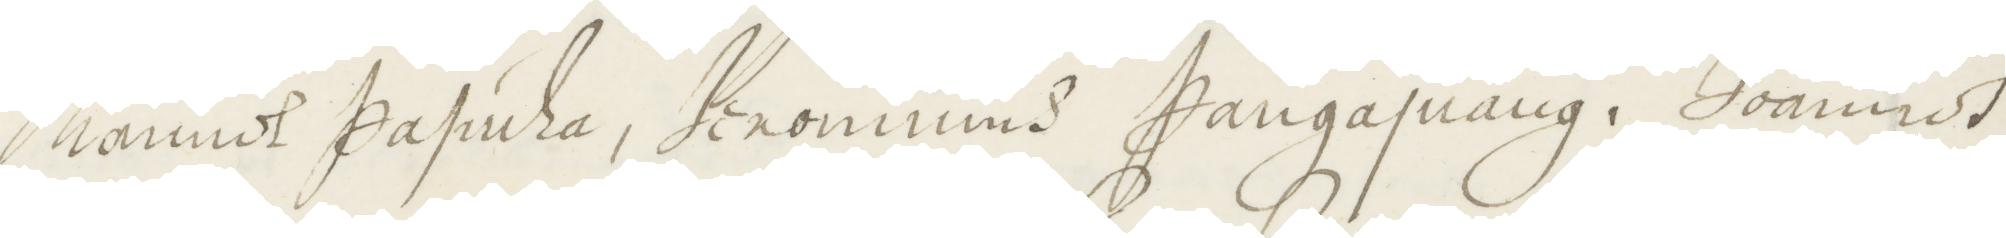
Manuel Papuha, Ieronimus Pangajuang, Ioannes
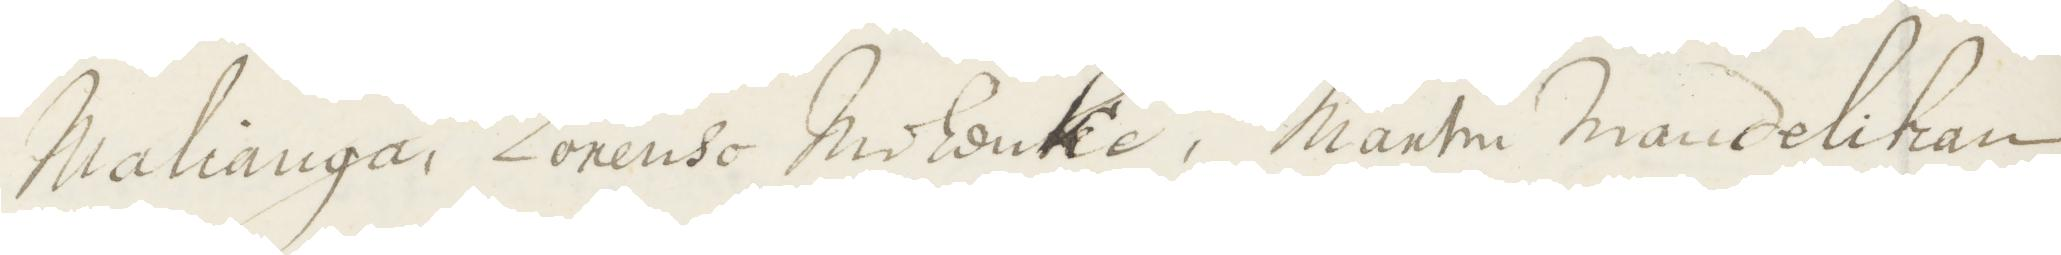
Malianga, Lorenso Mehenke, Martin Mandelikan,
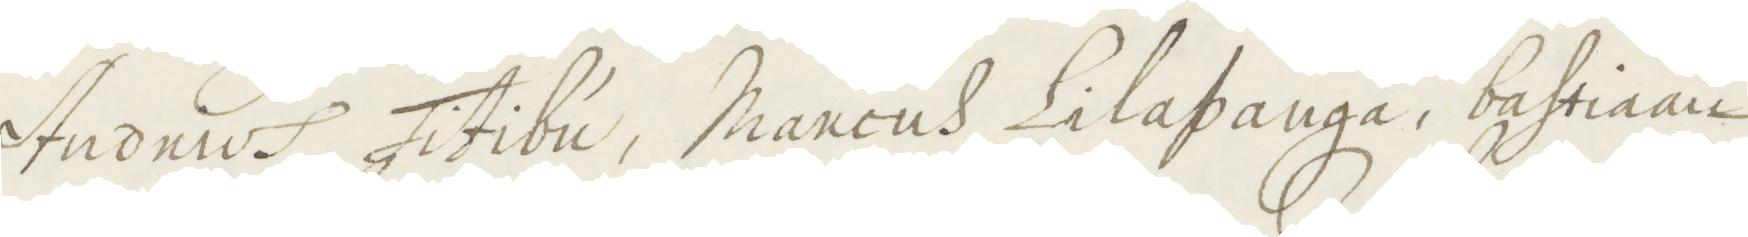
Andries Titibu, Marcus Lilapanga, bastiaan
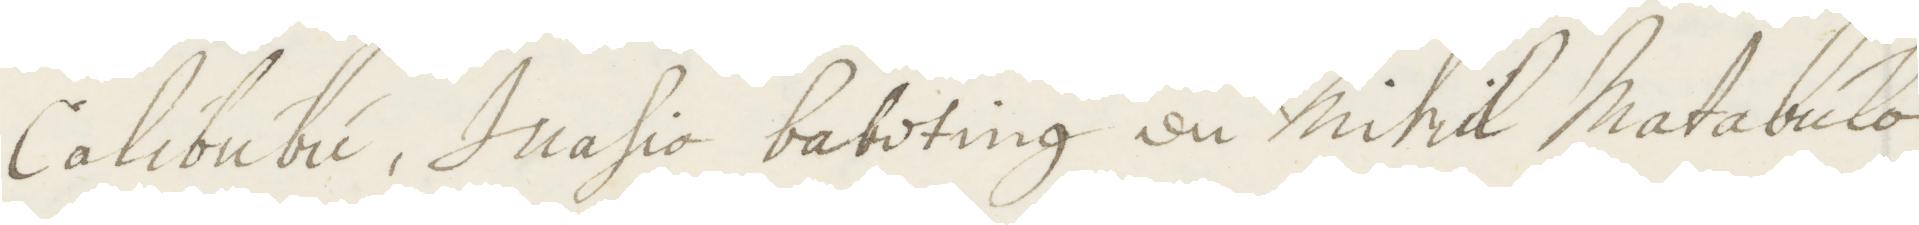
Calibubu, Inasio babeting en Mikil Masabulo
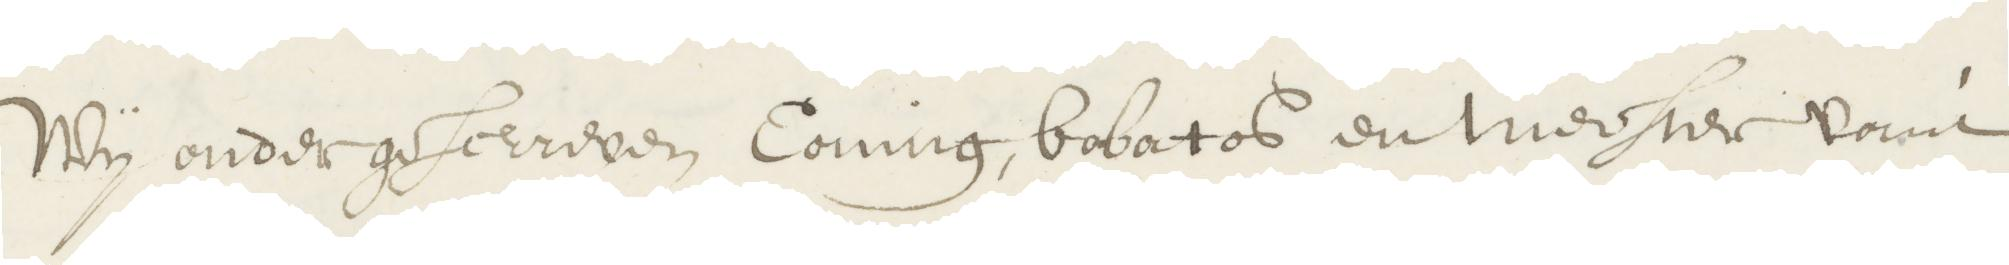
Wij ondergeschreven Coning, babatos en meester van't
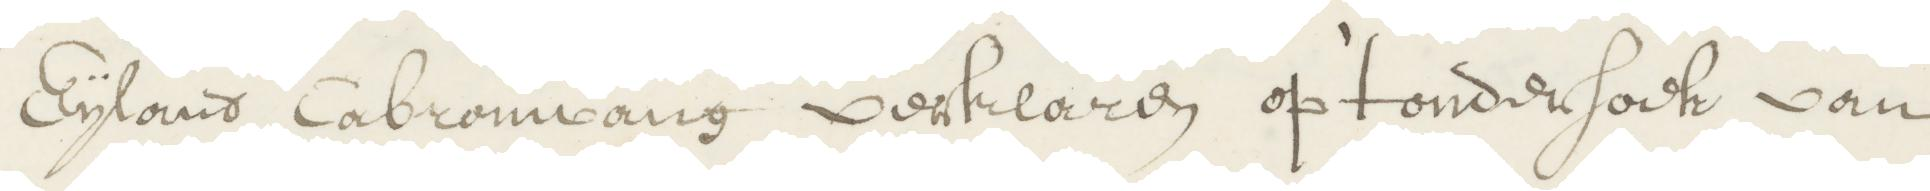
Eijland Cabrouwang verklaren op ’tondersoek van
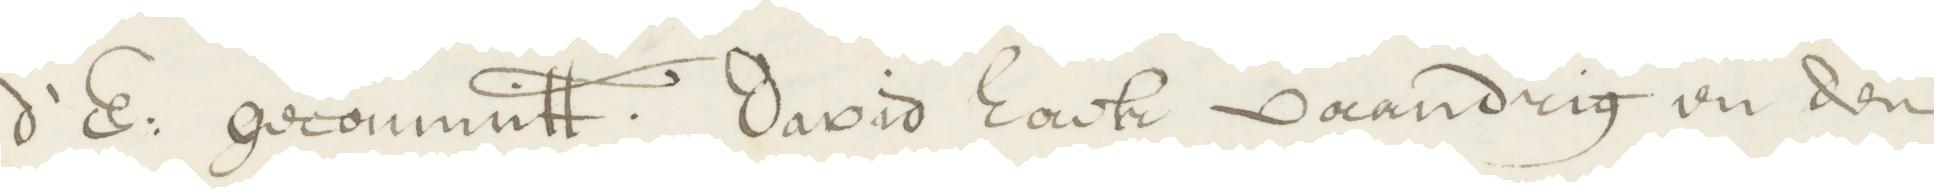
d’E: gecommitt. david haek vaandrig en den
